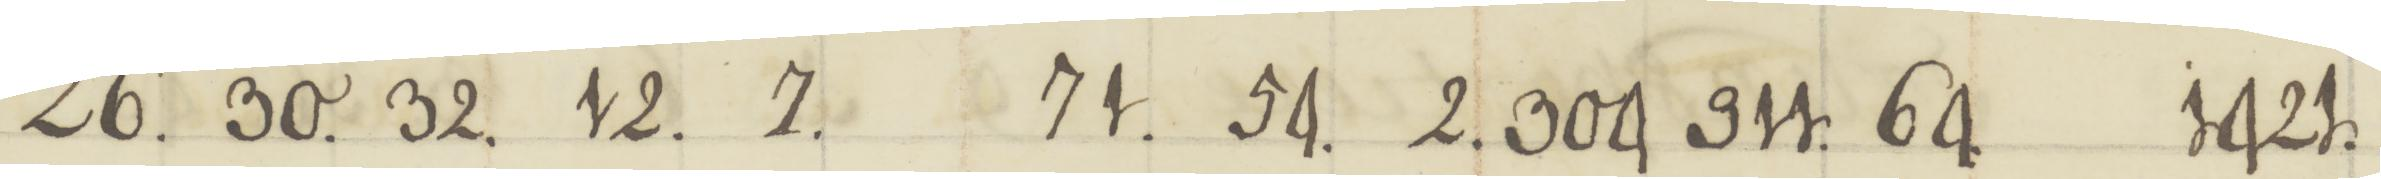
26. 30. 32. 12. 7. 71. 54. 2. 304 311. 64. 1421.
